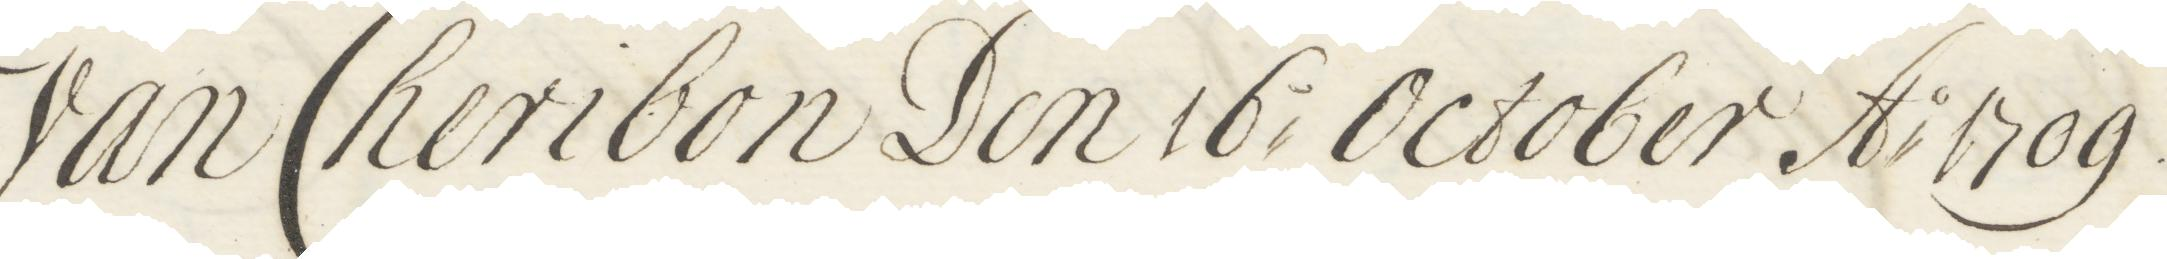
Van Cheribon Den 16„' October A„o 1709
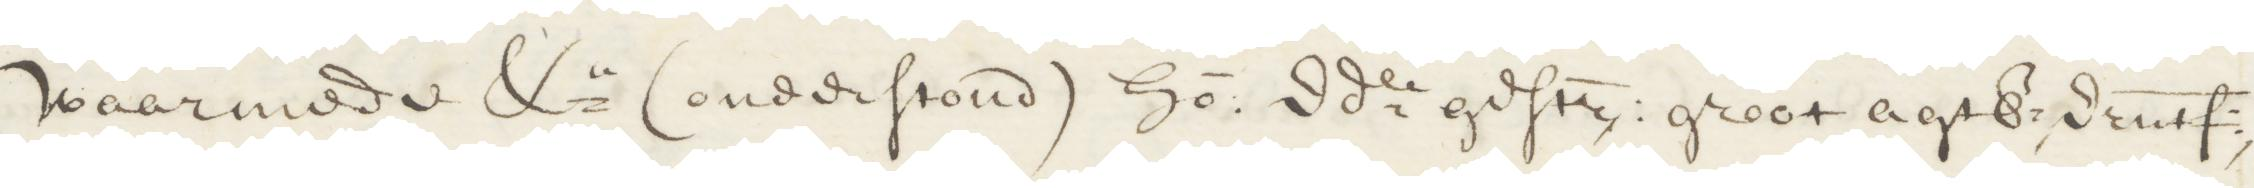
waarmede &=a (onderstond) ho: Ed=le gestr: groot, agtb:, Erntf:
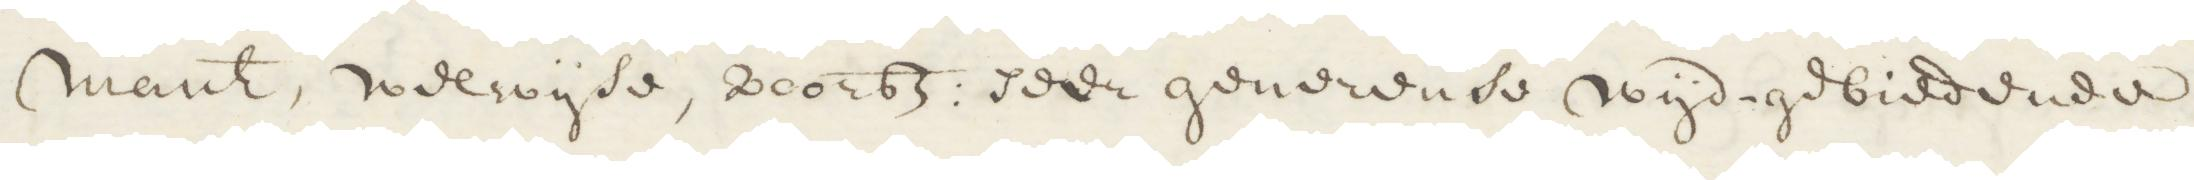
manh, welwijse, voorsz: seer genereuse wijd-gebiedende
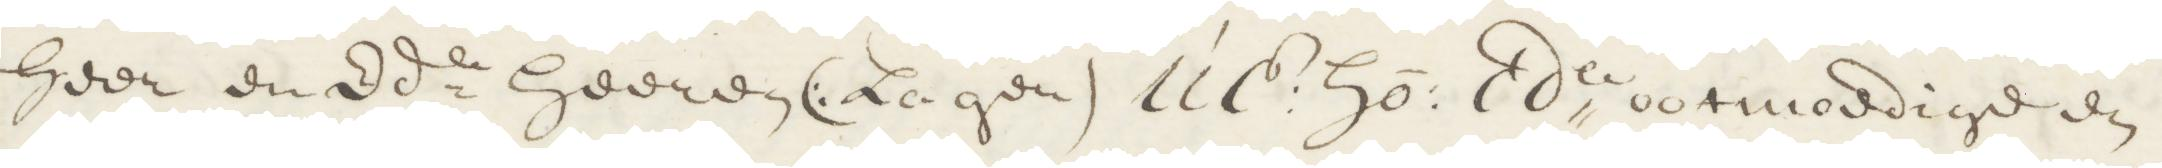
heer en Ed=le heeren (:lager) UE: ho: Ed„le ootmoedige en
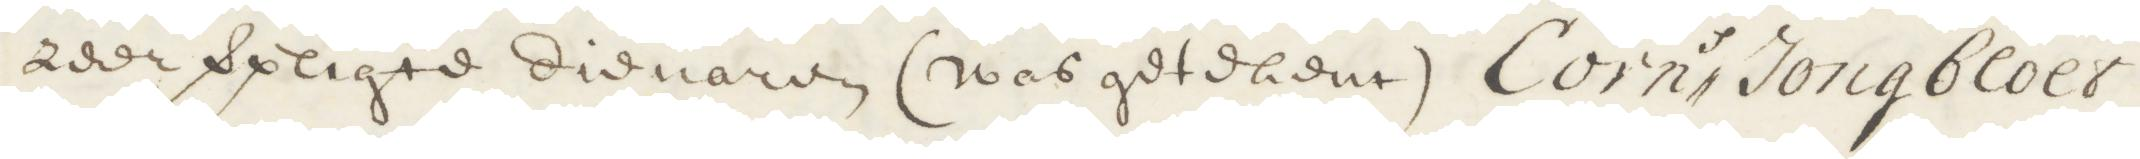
zeer verpligte dienaren (was getekent) Corn„s Jongbloet
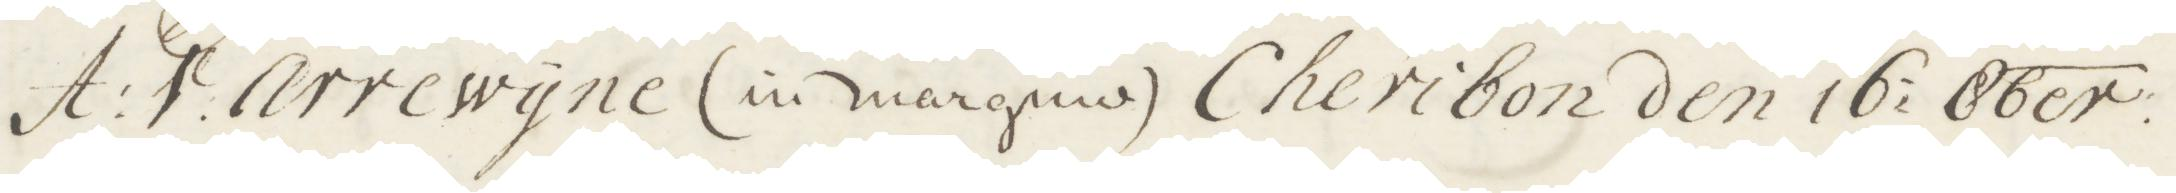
A: V: arrewijne (in margine) Cheribon den 16: 8ber:
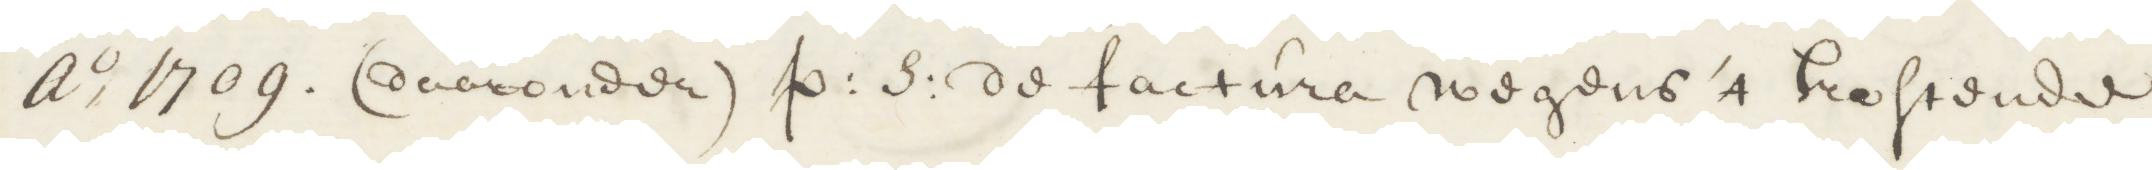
A„o 1709. (daaronder) p: s: de factura wegens ’t kostende
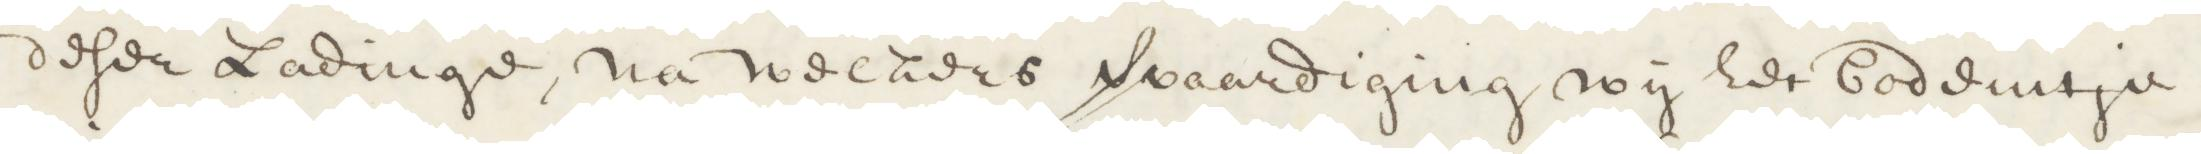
deser ladinge, na welkers vervaardiging wij het bodemtje
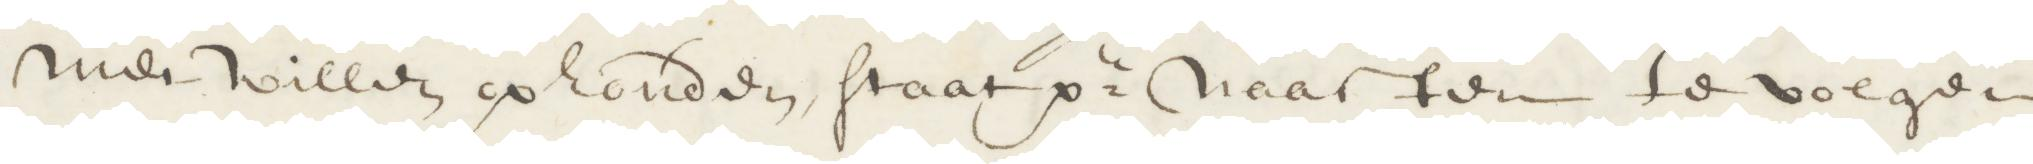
niet willen ophouden, staat p=r naasten te volgen
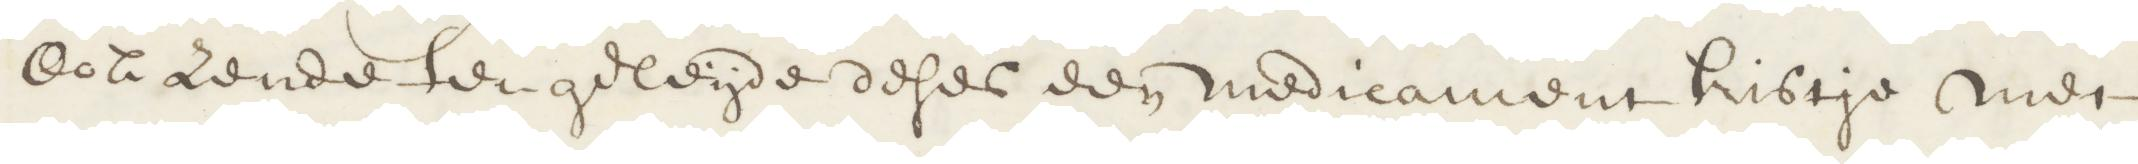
Ook zende ten geleijde deses een medicament kistje met
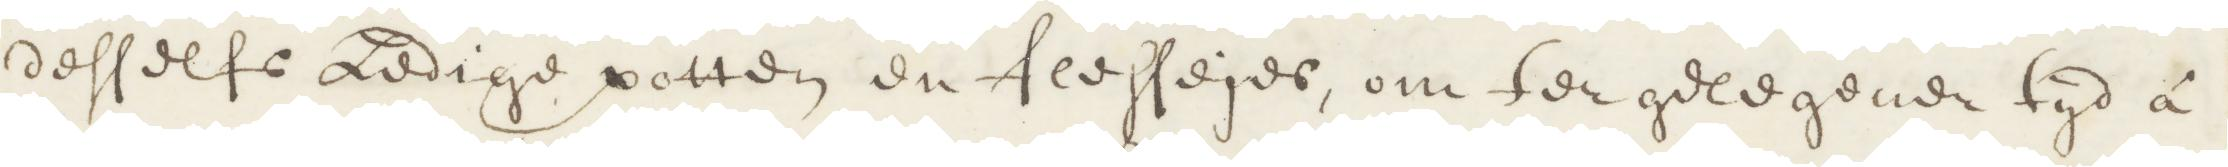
desselfs ledige potten en flessejes, om ter gelegener tijd á
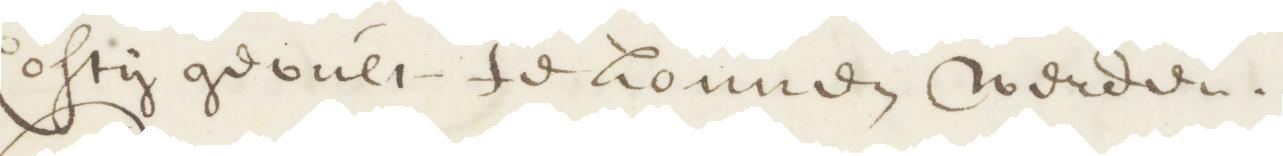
Costij gevult te konnen werden.
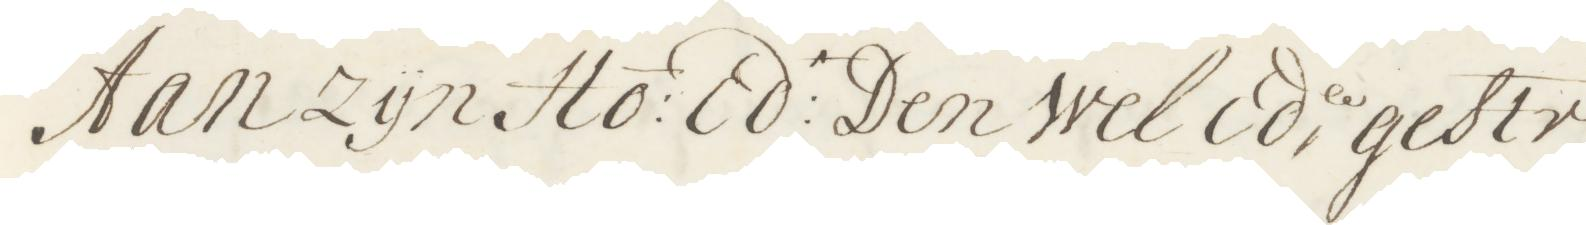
Aan zijn Ho: Ed: Den wel Ed„le gestr
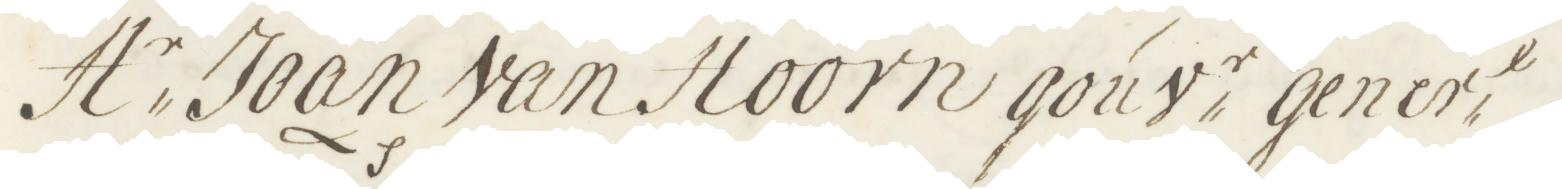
H„r Ioan van Hoorn gouv„r gener„l
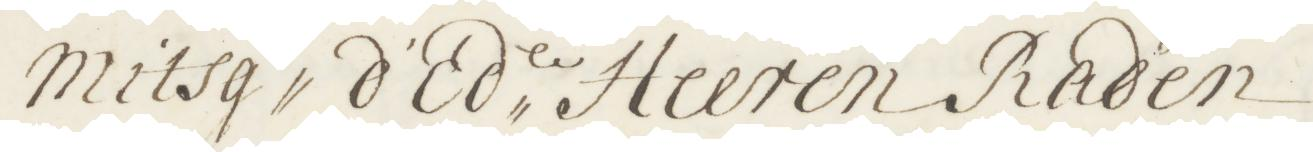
mitsg„s d’ Ed„le Heeren Raden
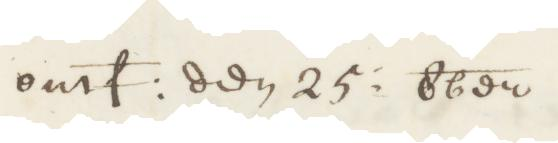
ontf: den 25: 8ber
